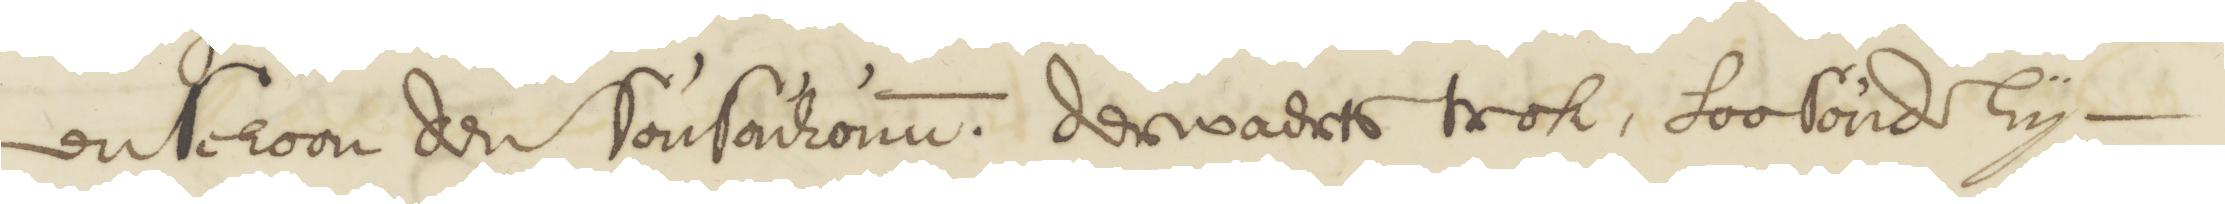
en schoon den sousouhoun. derwaerts trok, soo soude hij —
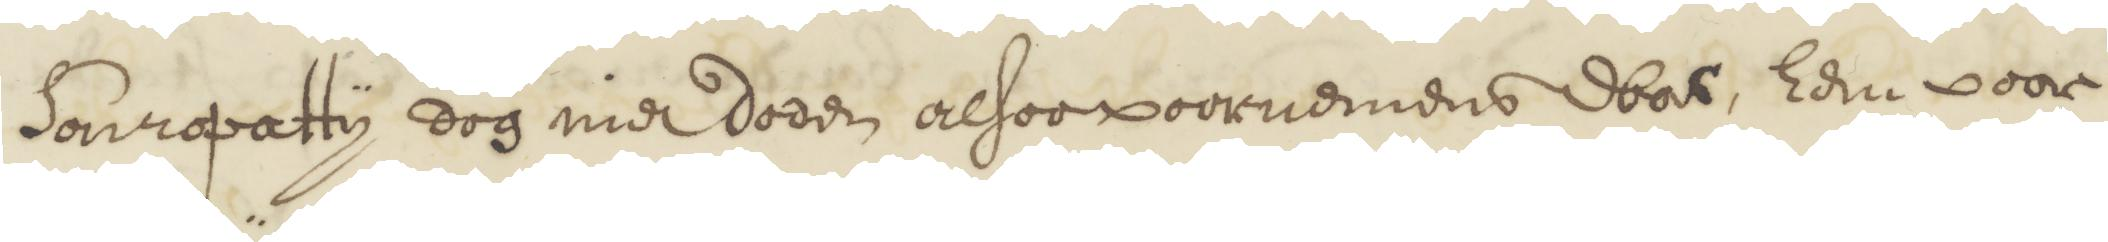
souropattij dog niet doden alsoo voornemens was, hem voor
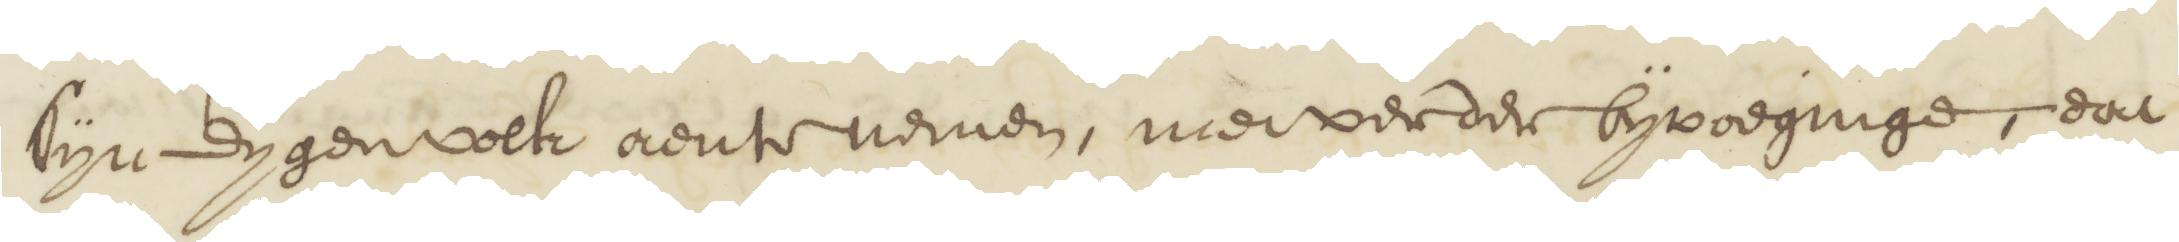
sijn eijgenvolk aentenemen, met verder bijvoeginge, dat
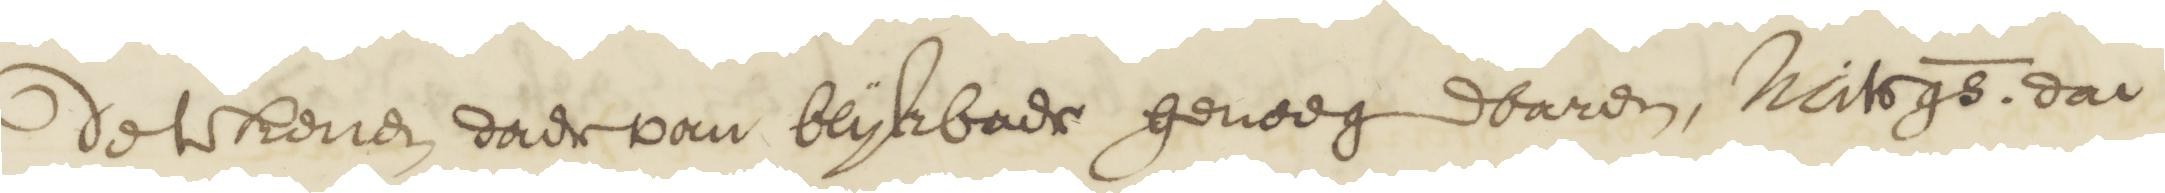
de tekenen daer van blijkbaer genoeg waren, Mitsgs. dat
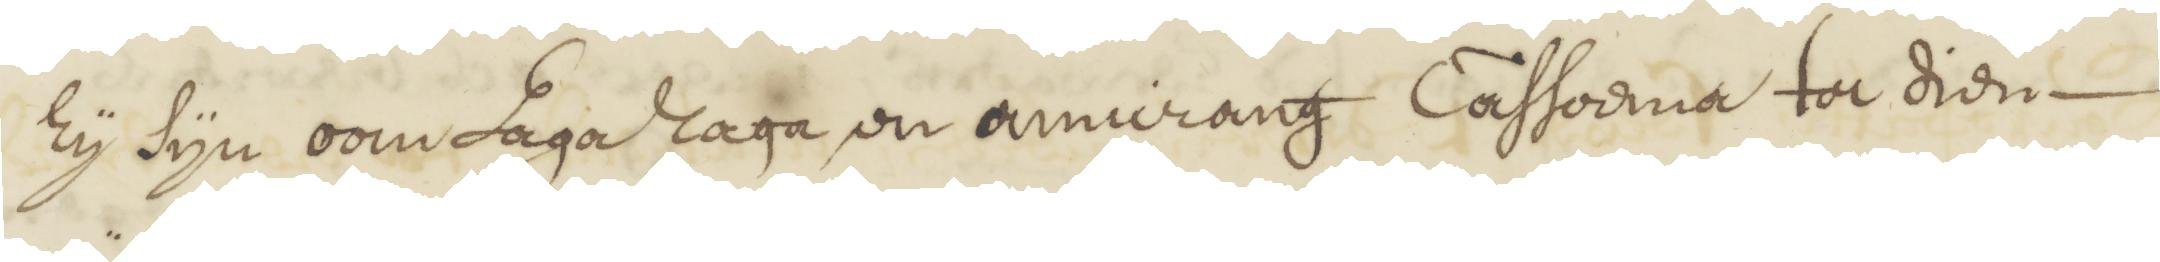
hij sijn oom Laga Raga, en annirang Cassoema tot dien —
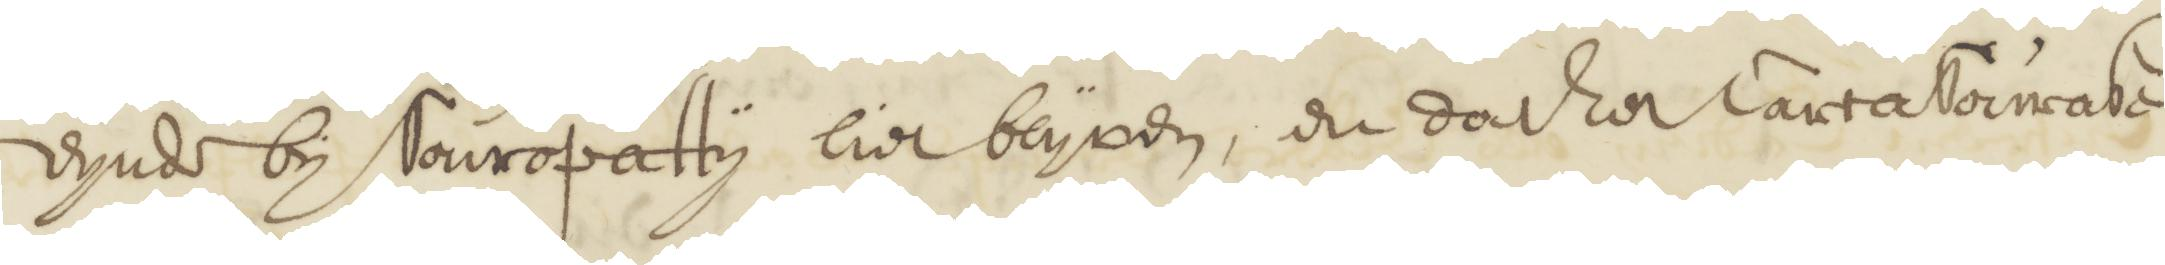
eijnde bij souropattij liet blijven, en dat het Cartasourase
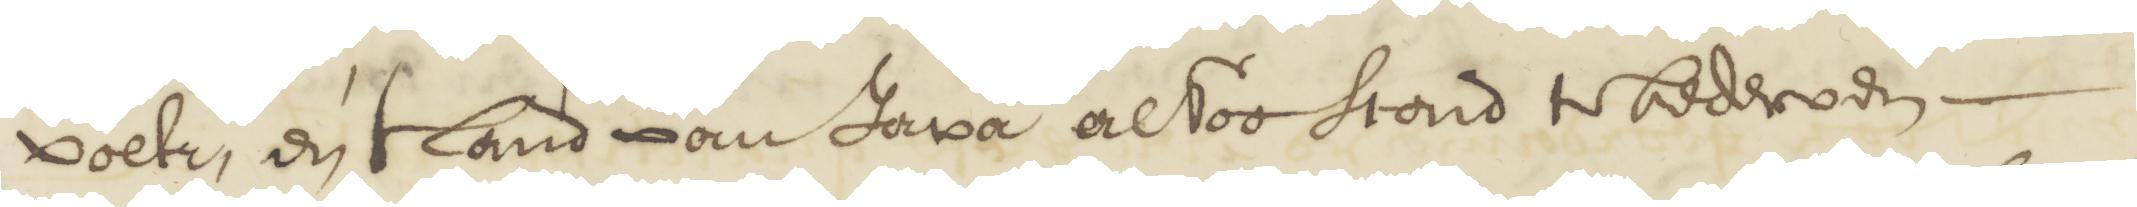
volk, en 'tland van Iava alsoo stond tebederven —
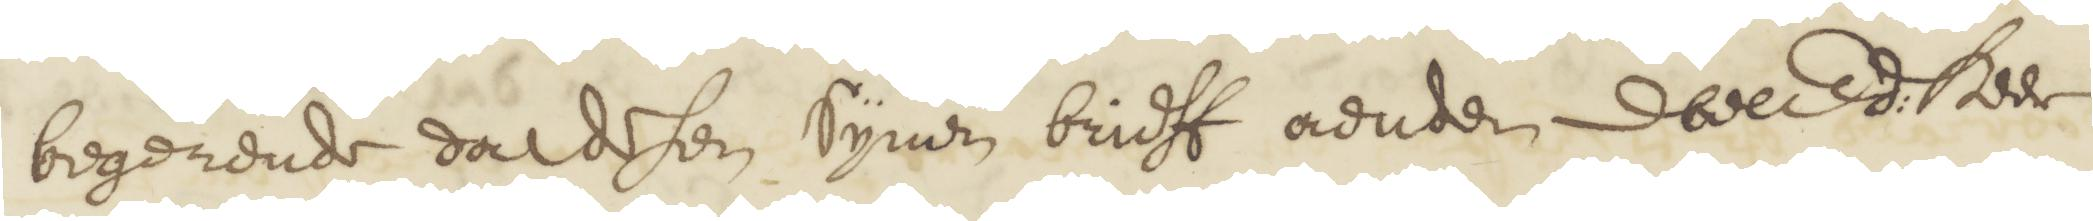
begerende dat desen sijnen brieff aenden wel Ed: Heer
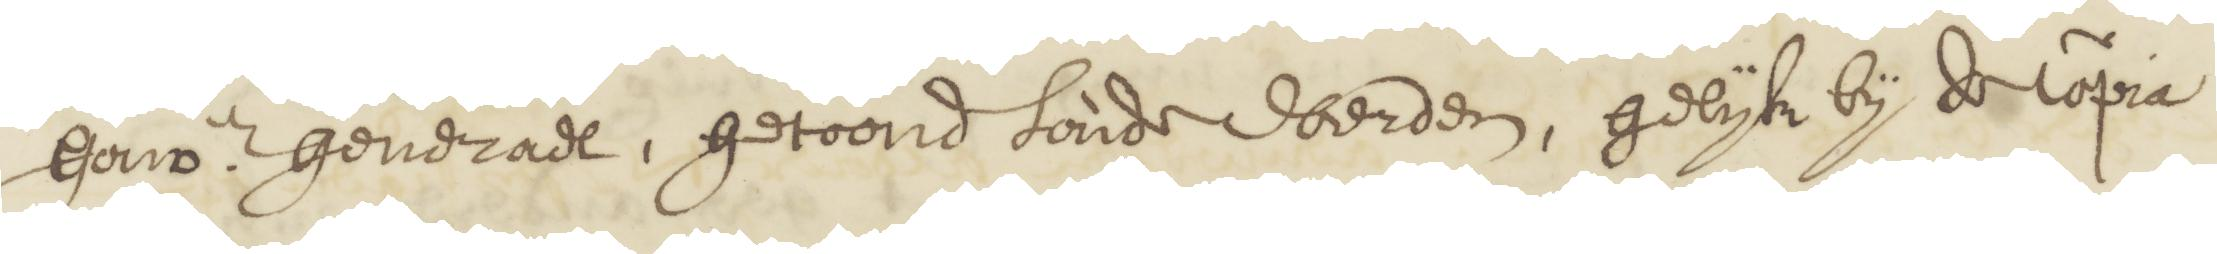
gouv:r generael, getoond soude werden, gelijk bij de Copia
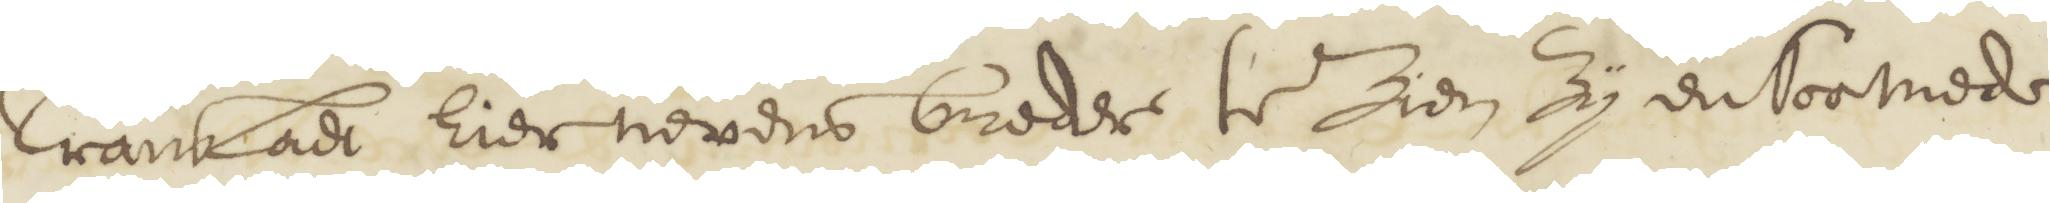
Translaet hier nevens breder tezien zij en soomede
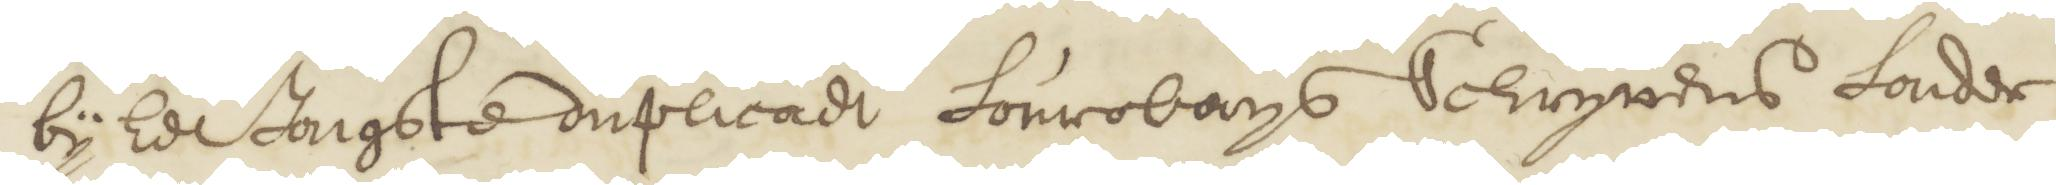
bij het Iongste duplicaet sourobaijs schrijvens sonder
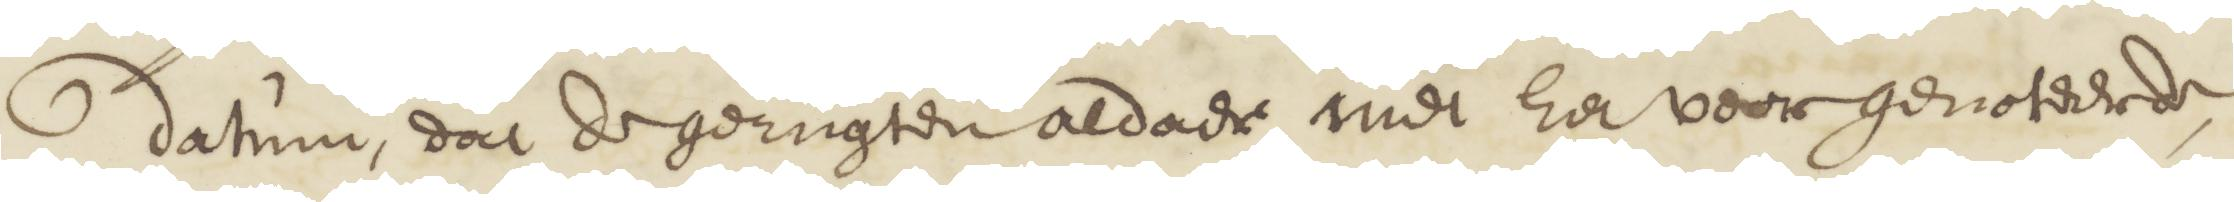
datum, dat de gerugten aldaer met het voor genoteerde,
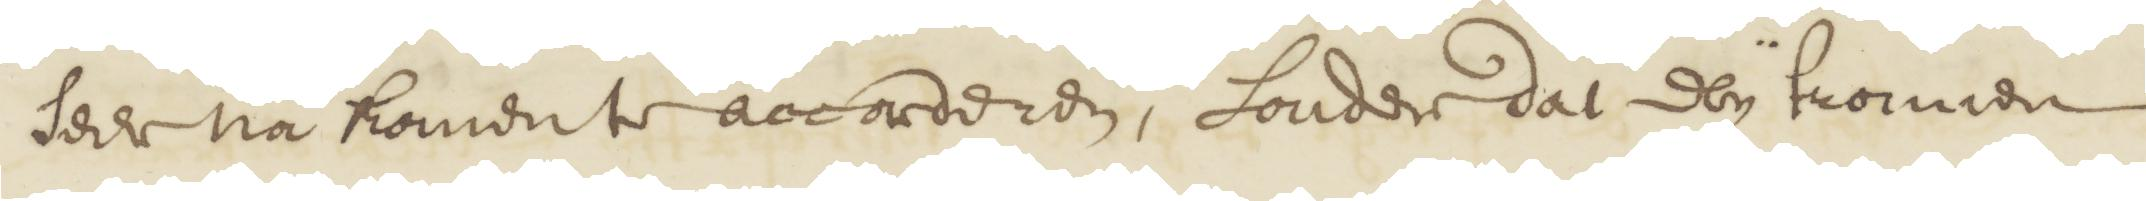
seer na komen te accorderen, sonder dat wij konnen
